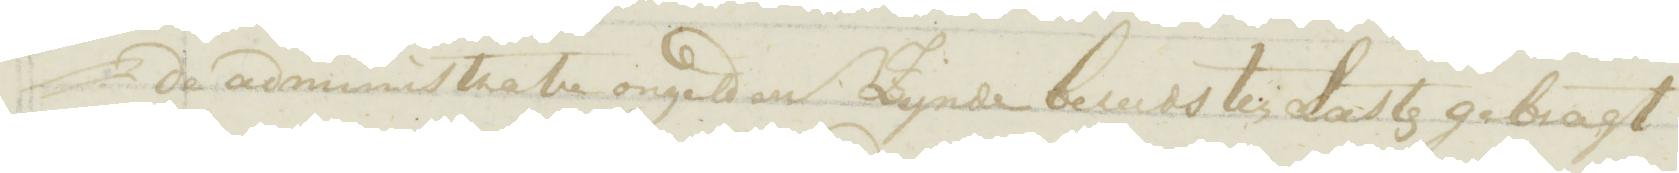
= de administratie ongelden zijnde bereeds ter Lasten gebragt
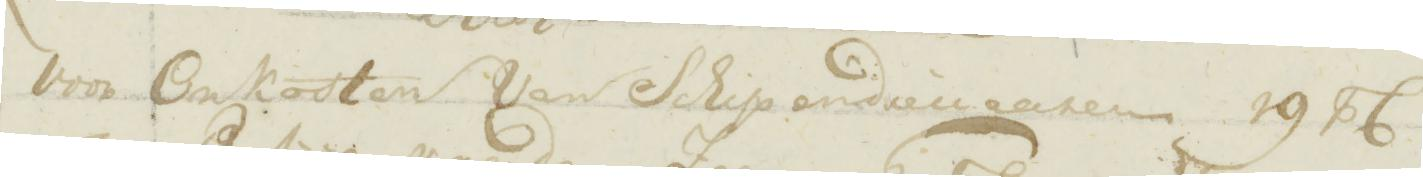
Voor Onkosten van schip en dienaaren 19 pC
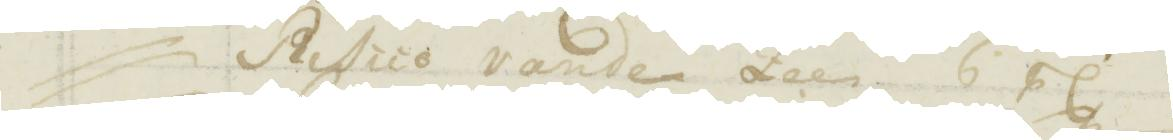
= Risico vande zee 6 pC
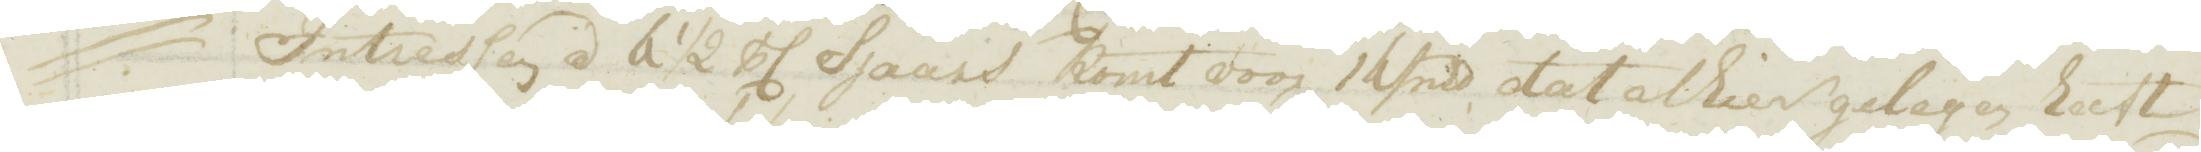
= Intressen @ 4½ pC sjaars komt voor 14/md, dat alhier gelagen heeft
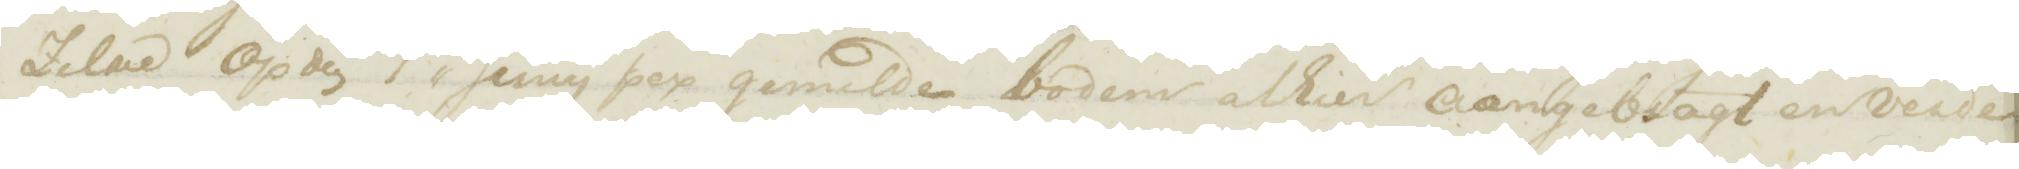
zelve Op den 7„e Junij per gemelde bodem alhier aangebragt en verde
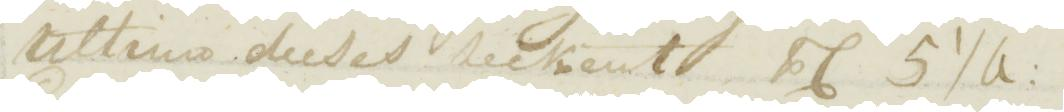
ultimo deeses teekent pC 5¼:
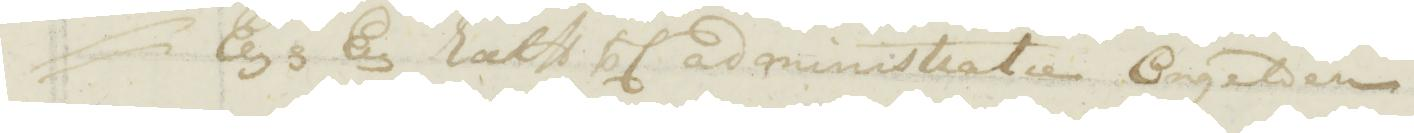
= Een & Een halff pC: administratien Ongelden
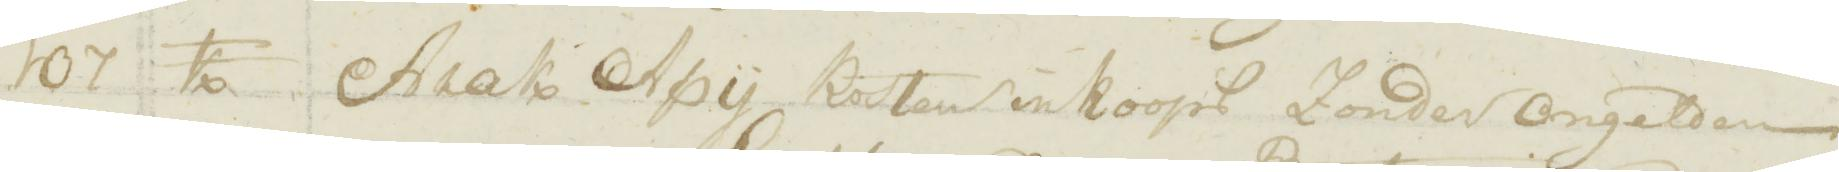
107 lb. Arak Apij kosten inkoops zonder Ongelden
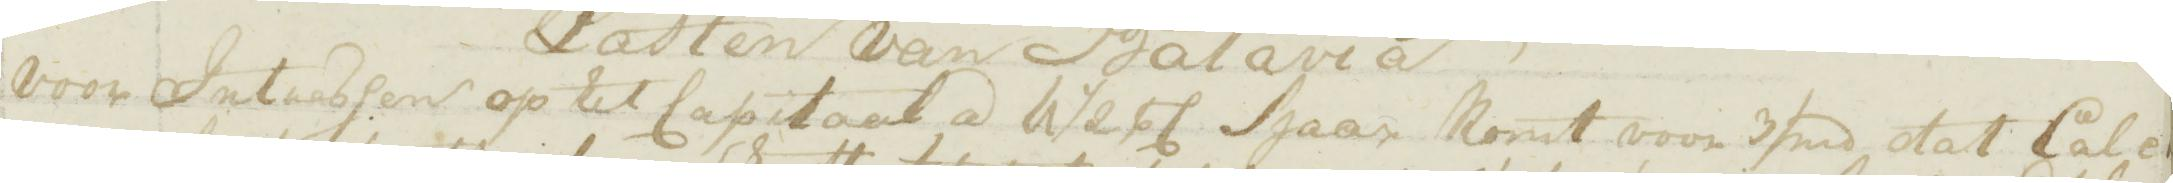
voor Intressen op het Capitaal @ 4½ pC sjaar komt voor 3/md dat Cale
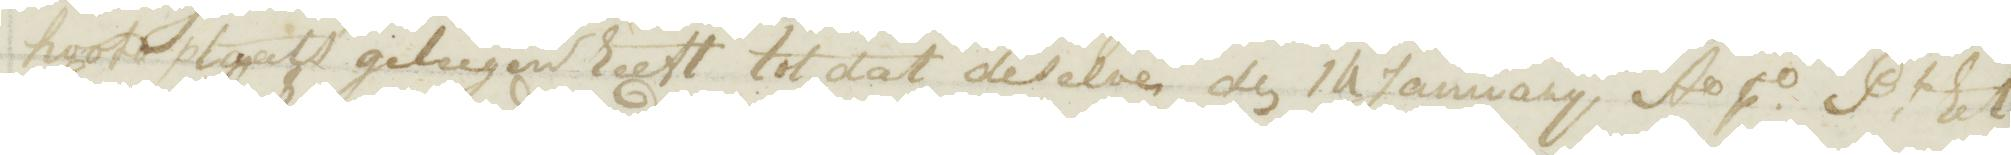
hoofd plaats geleegen heeft tot dat deselve den 14 Januarij Ao p.o P,r het
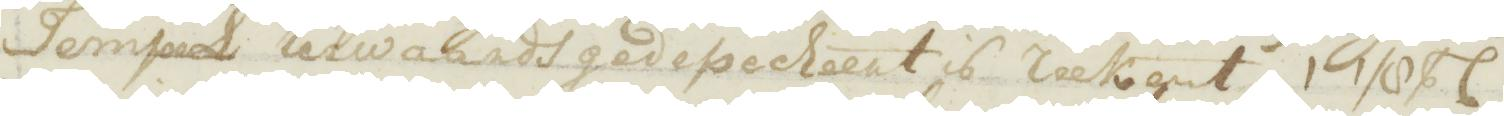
Tempel herwaards gedepecheert is reekent 1 1/8 pC
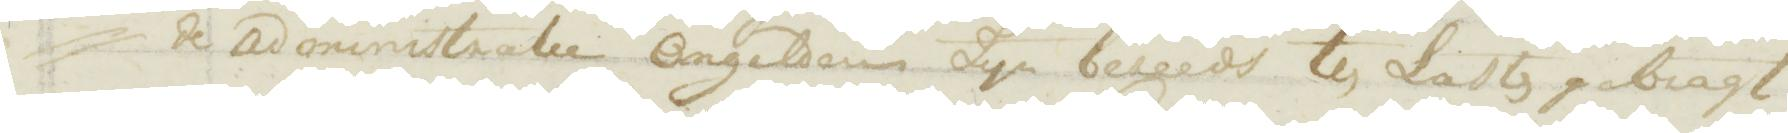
= de administratie Ongelden zyn bereeds ten Lasten gebragt
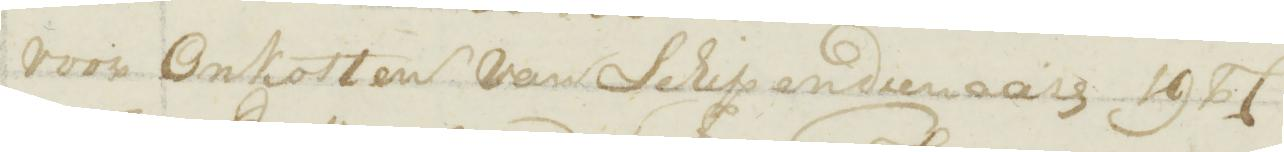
voor Onkosten van schip en dienaaren 19 pC
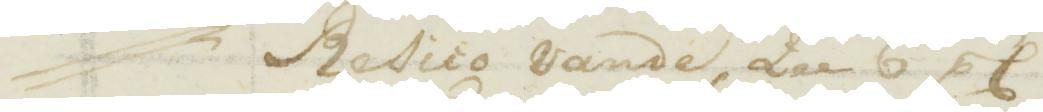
= Resico vande zee 6 pC
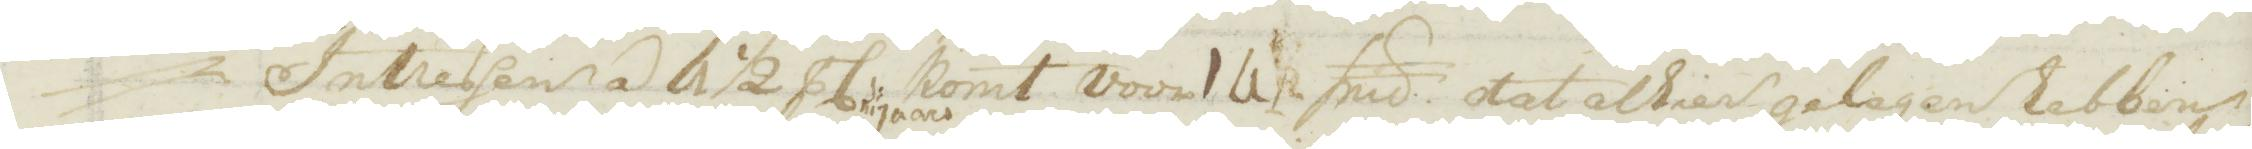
= Intressen @ d 4½ pC „ komt voor 14½/md: dat alhier gelegen hebben
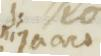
Jaars
